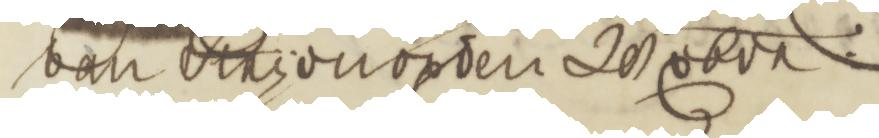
van Strijen op den 28 xber.
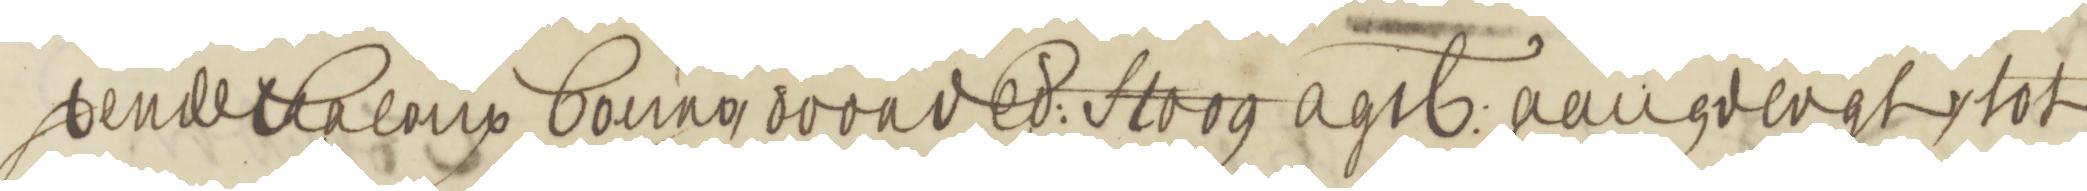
per de chaloup bouro door UEd: Hoog agtb: aangelegt, tot
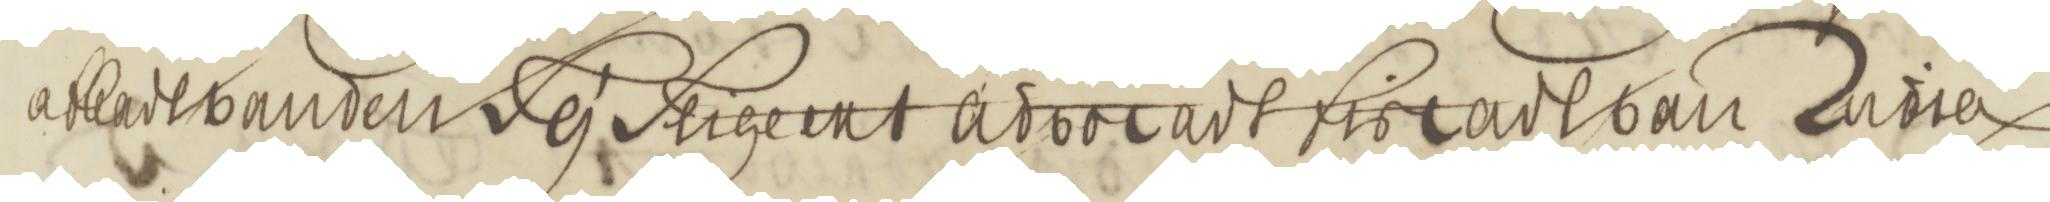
afhael van E g' Eligeert advocaet fiscael van India
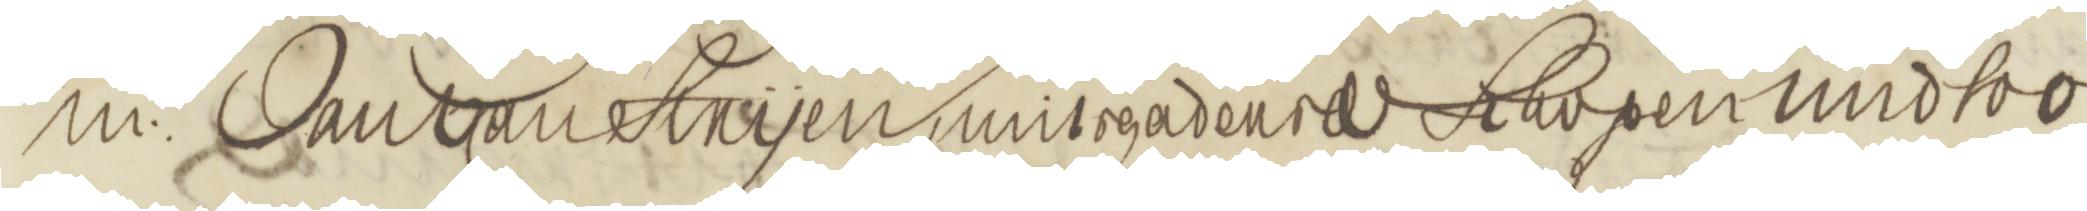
m:' Ian van Strijen, mitsgaders de Schepen midloo
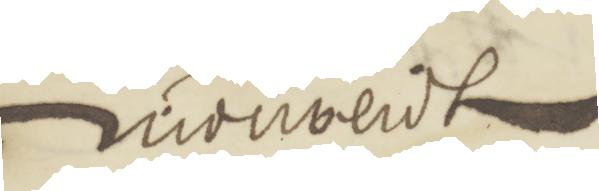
nieuvliet
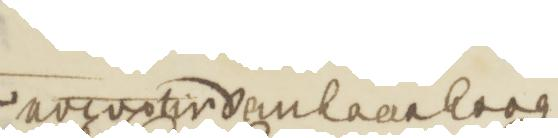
receptie van haar hoog
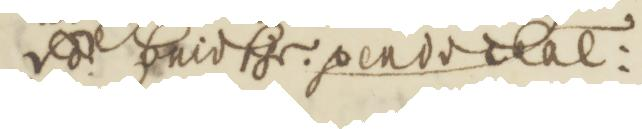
Ed:s briefje. per de chal:
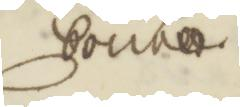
bouro
